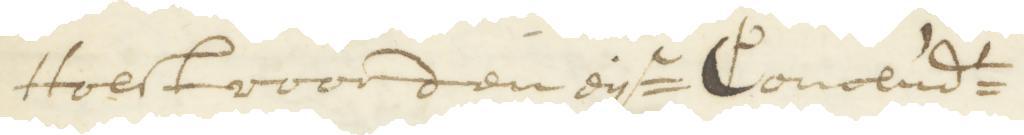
Holst voor den eij=r Conclud=t
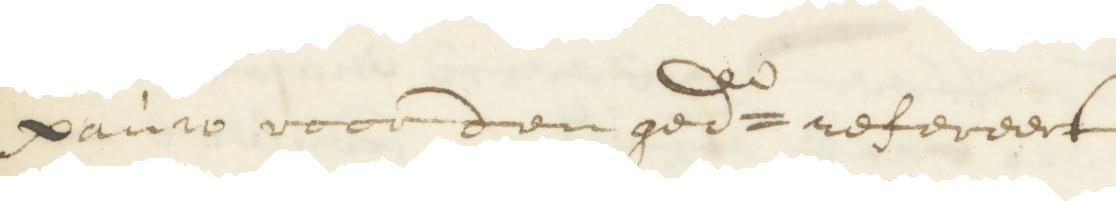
pauw voor den ged=e refereert
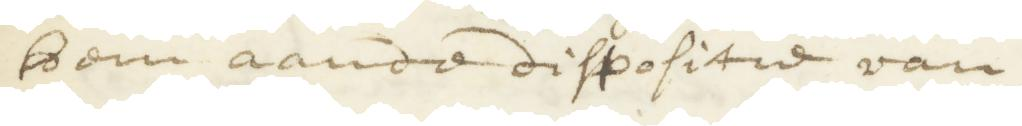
hem aande dispositie van
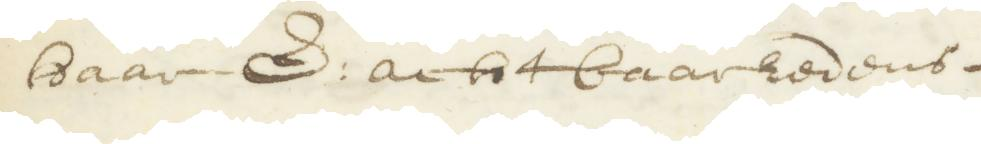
haar E: acht baarhedens
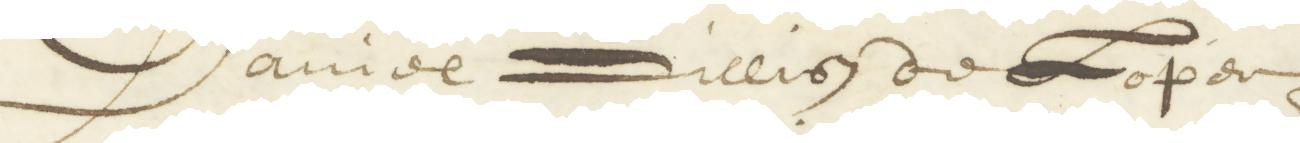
Daniel Gillis de Loper
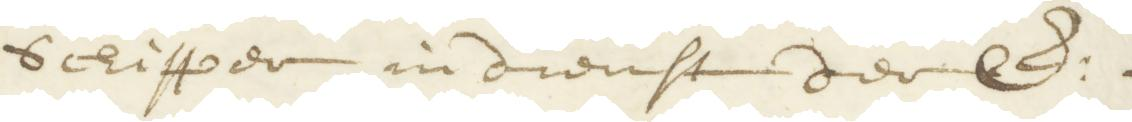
schipper in dienst der E:
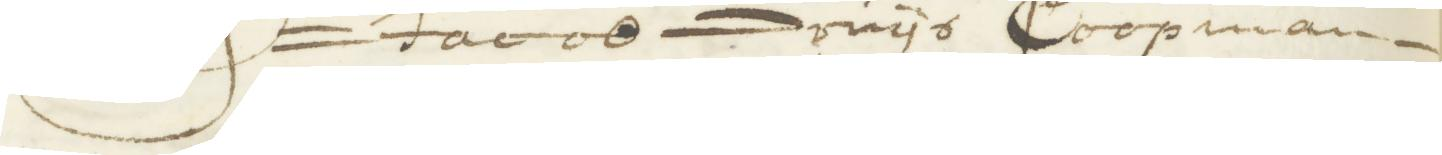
S=r Jacob Gruijs Coopman —
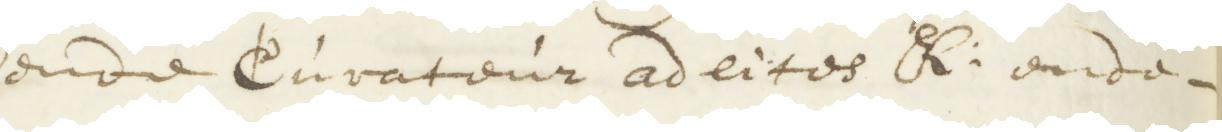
ende Curateur ad lites &: ende —
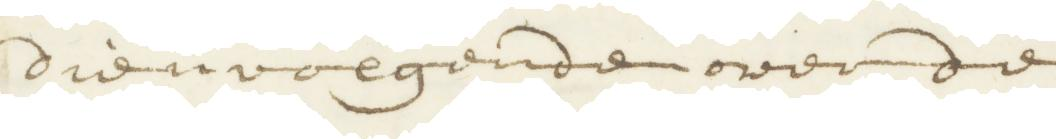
dien volgende over de
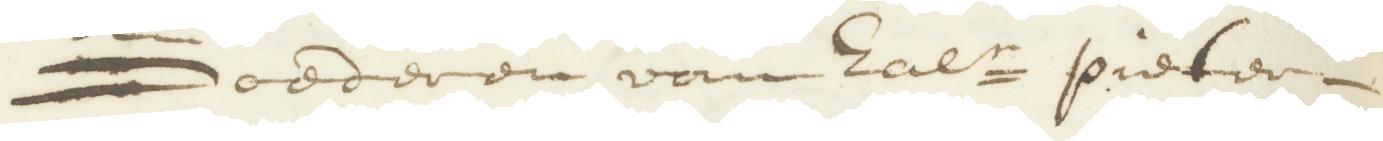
Goederen van zal=r pieter —
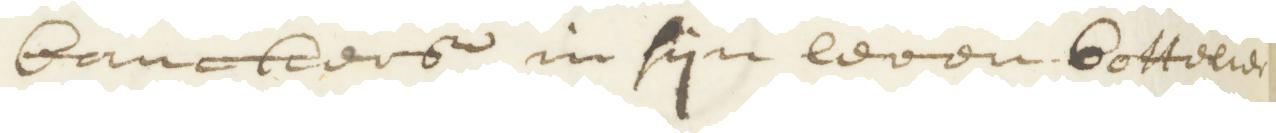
banckers in sijn leven bottelier
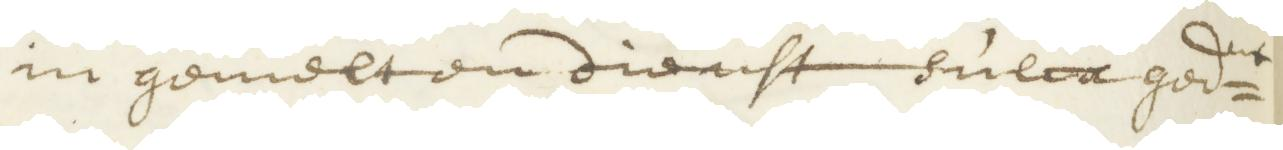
in gemelten dienst sulcx ged=t
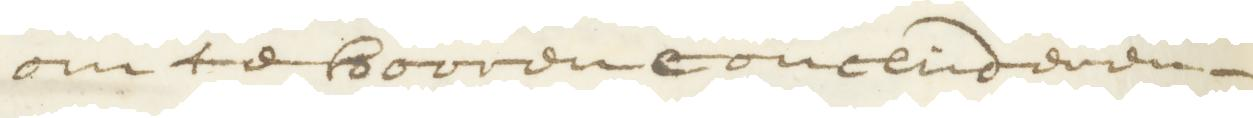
om te hooren concluderen —
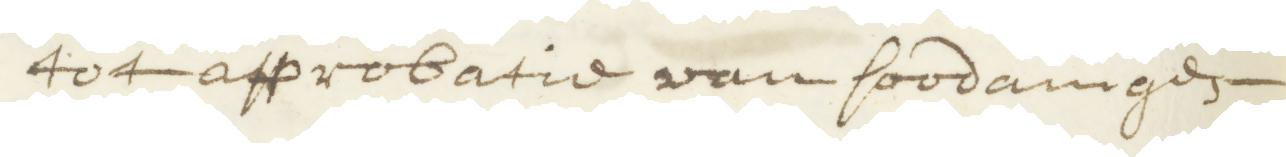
tot approbatie van soodanigen —
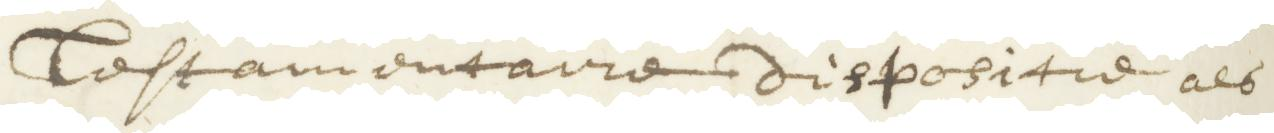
Testamentaire dispositie als
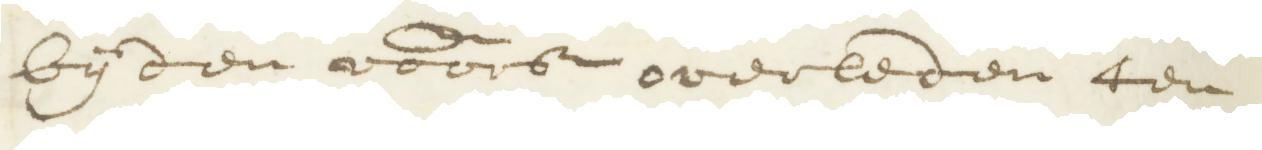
bij den voorsz overleden ten
